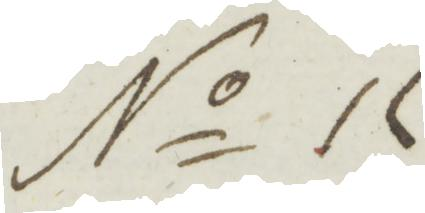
N=o 15
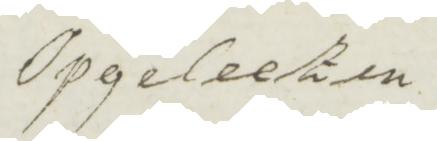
Opgeleezen
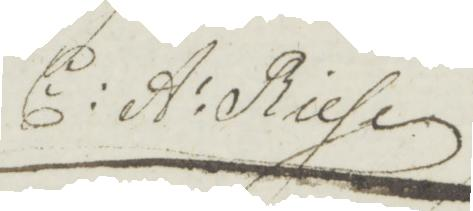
C: A: Riese
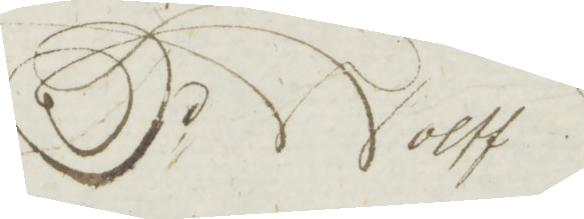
D„d Wolff
